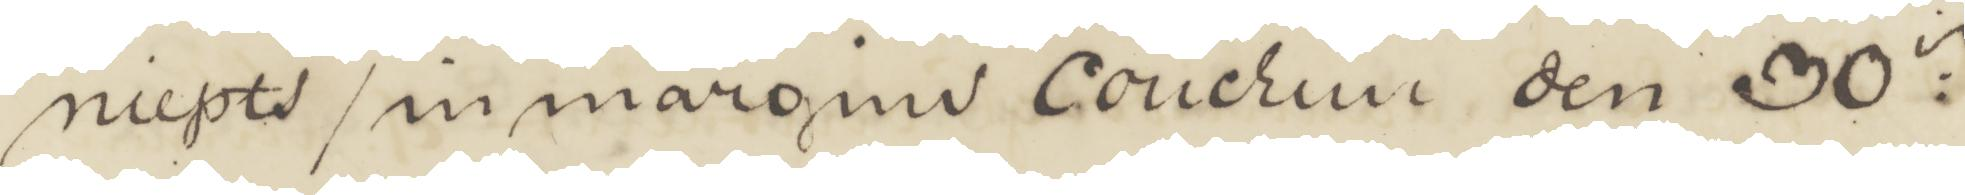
niepts / in margine couchim den 30:'
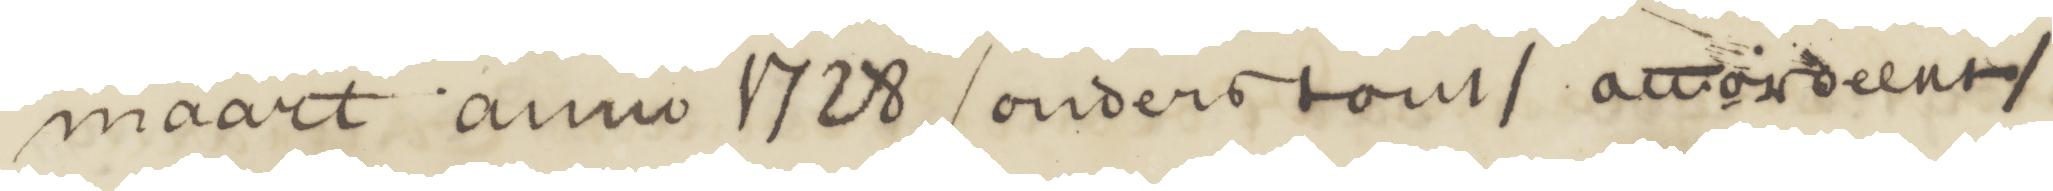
maart anno 1728 / onderstont / accordeert/
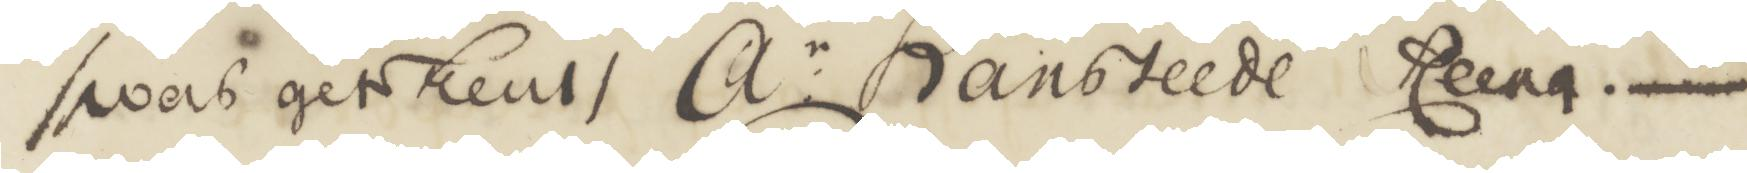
/was getekent/ A:r Hansteede Clerq. —
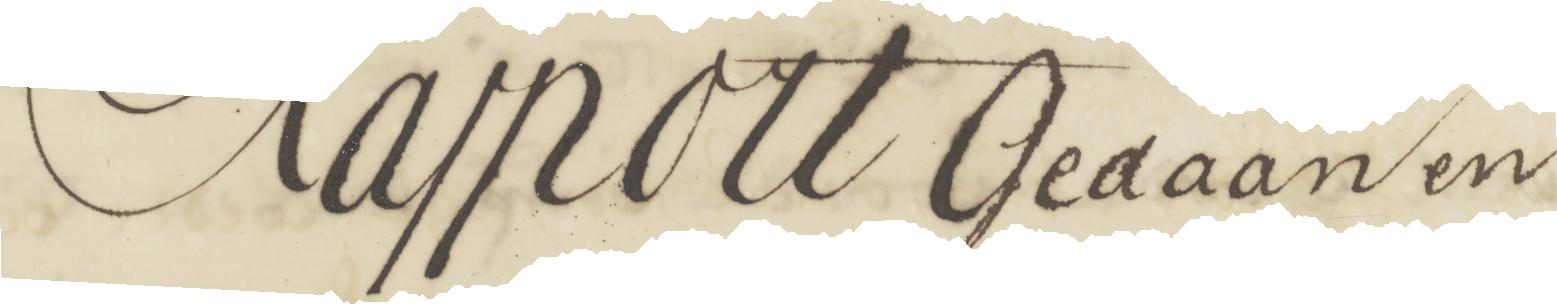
Rapport Gedaan en
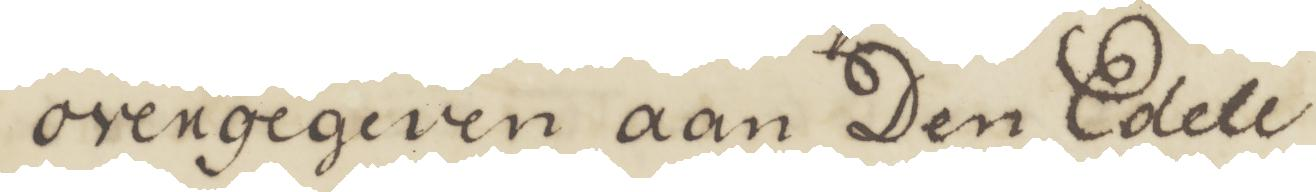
overgegeven aan Den Edele
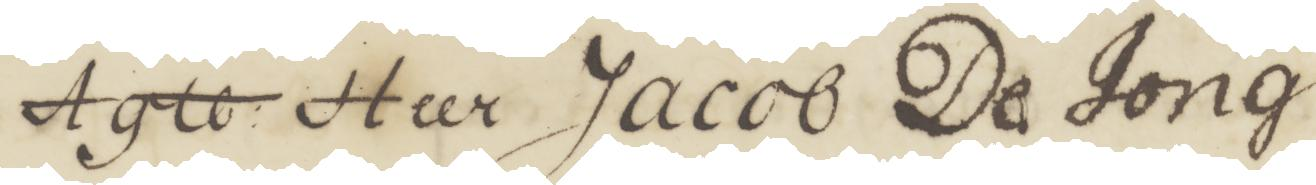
Agtb: Heer Jacob De Iong
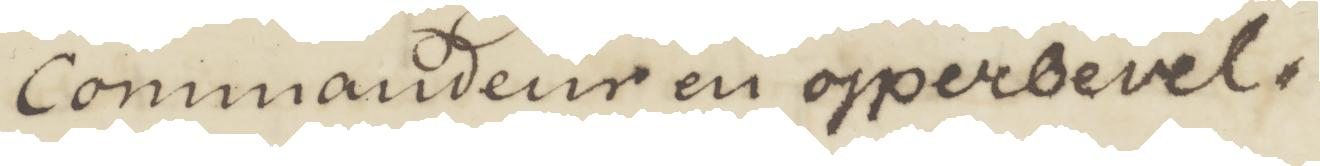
Commandeur en opperbevel„
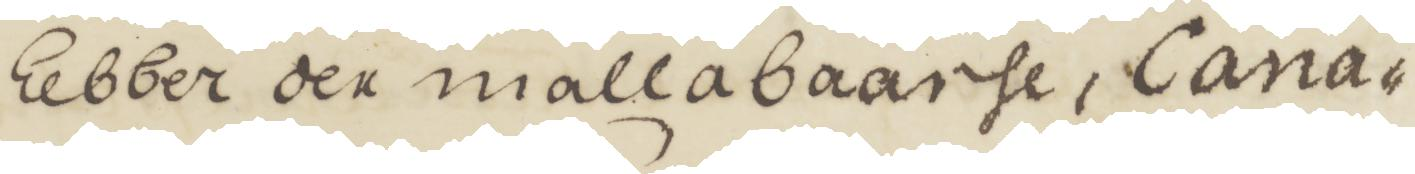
hebber der mallabaarse, Cana„
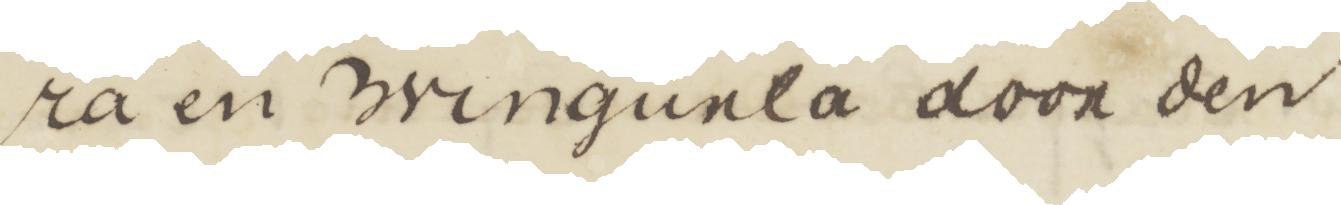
ra en Wingurla door den
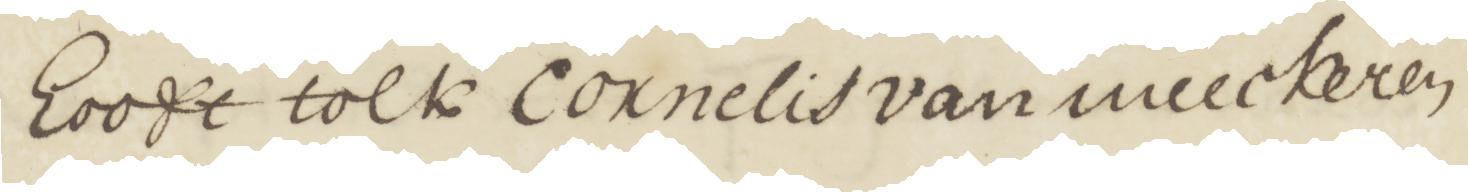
hooft tolk Cornelis van meeckeren
